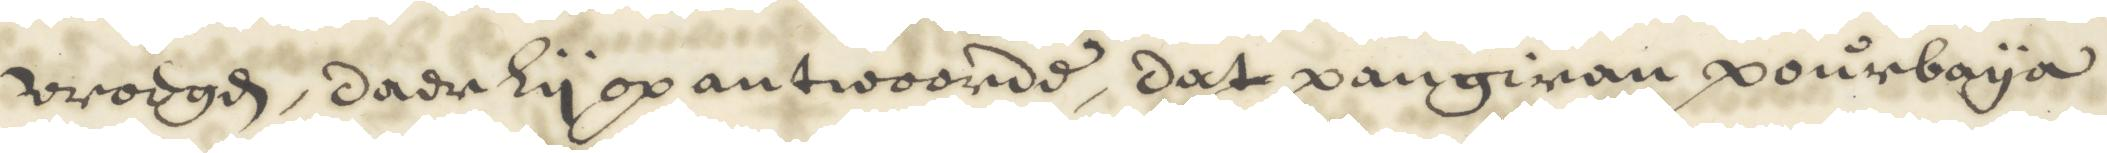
vroegen, daer hij op antwoorde, dat pangiran pourbaija
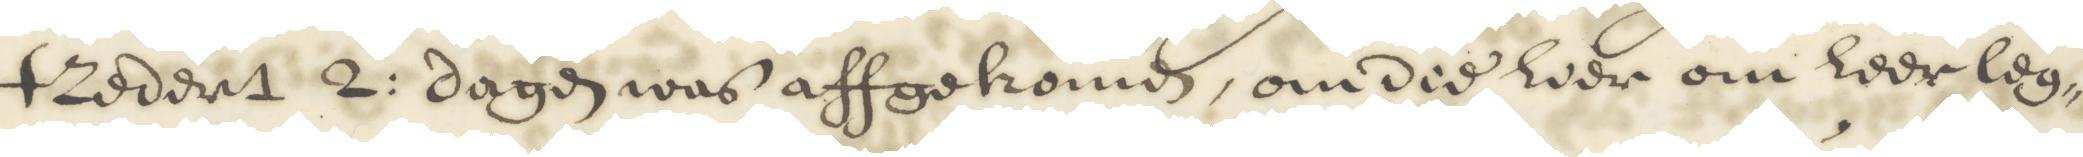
tzedert 2: dagen was affgekomen, om die hier om heer leg„
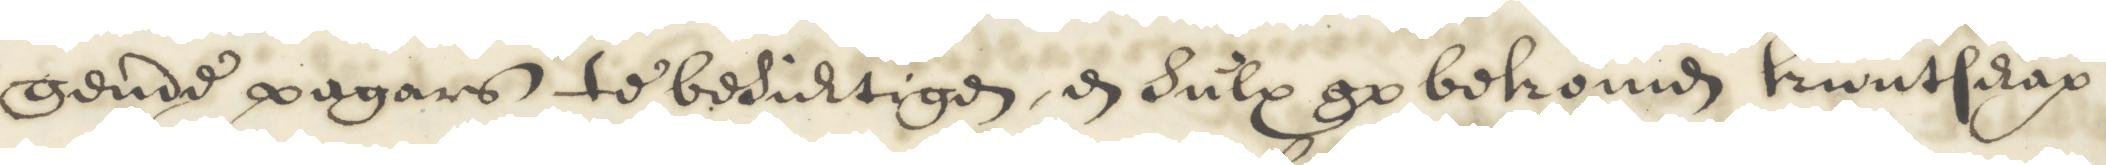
gende pagars te besichtigen, en sulx op bekomen kuntschap
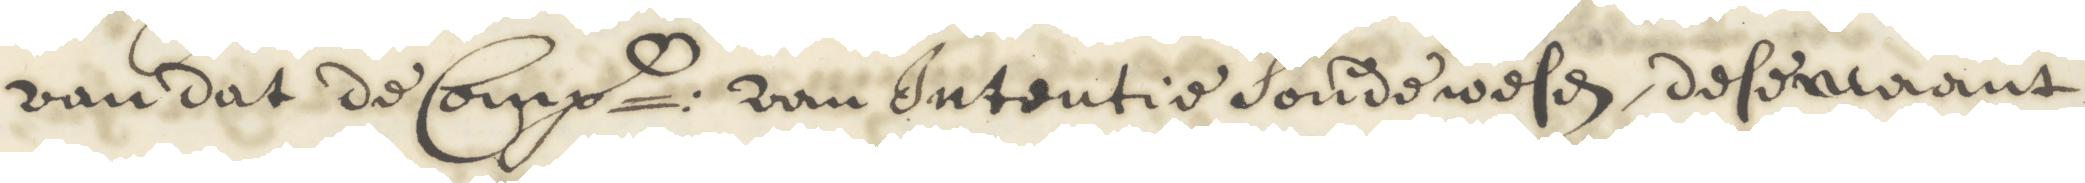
van dat de Comp=: van Intentie soude wesen, dese maant
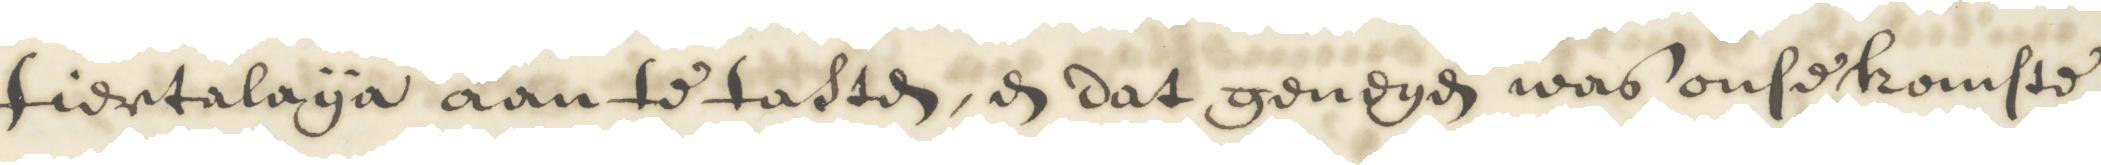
tiertalaija aan te tasten, en dat genegen was onse komste
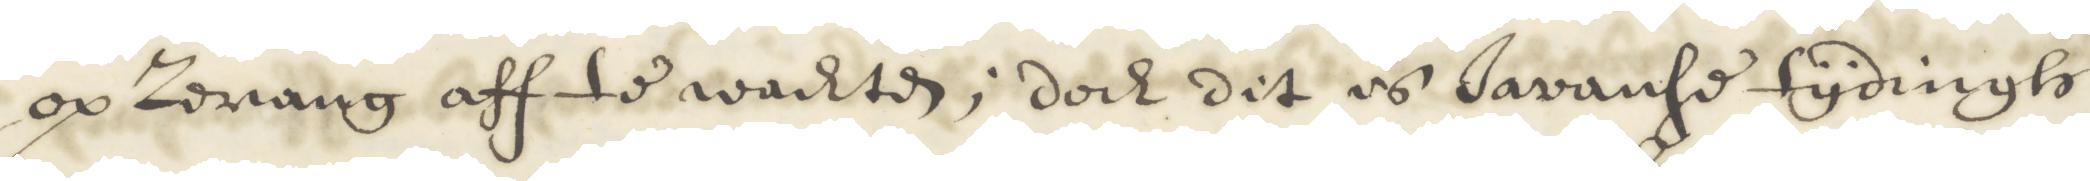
op zerang aff te wachten; doch dit is Javanse tijdingh
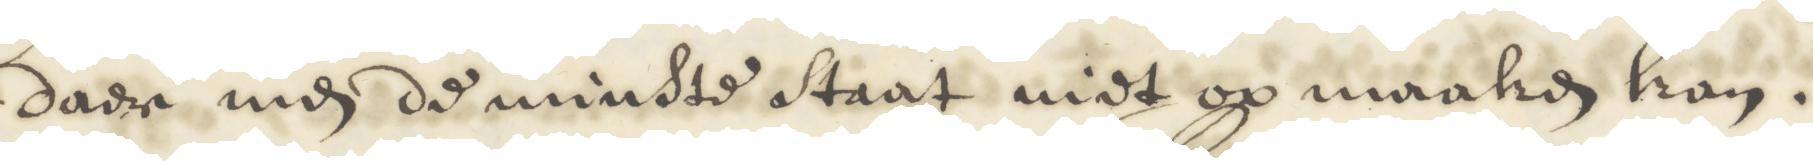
daer men de minste staat niet op maaken kan.
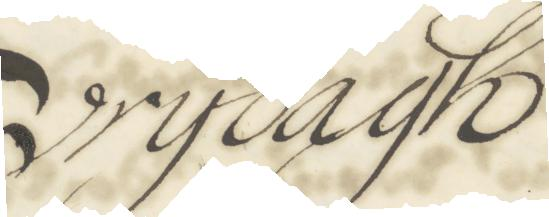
Vrijdagh.
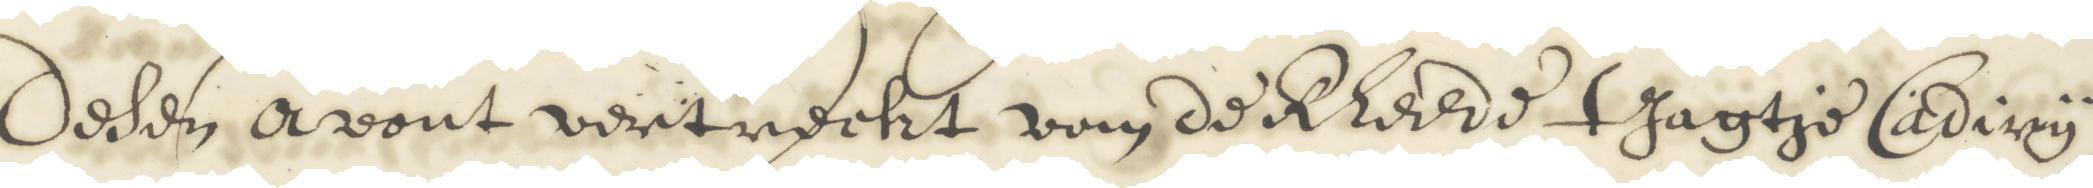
Desen avont vertreckt van de Rheede 't Jagtje Cadinij,
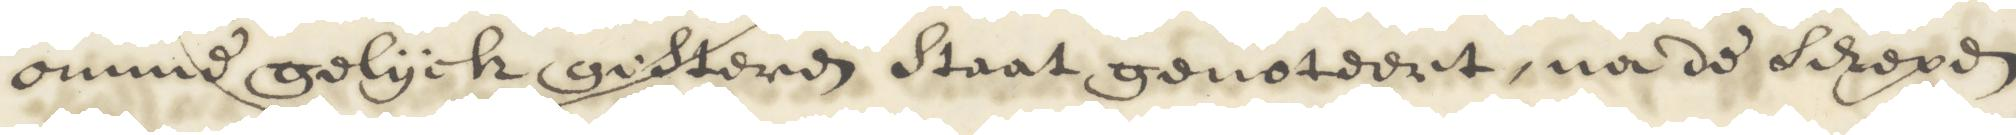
omme gelijck gisteren staat genoteert, na de schepen
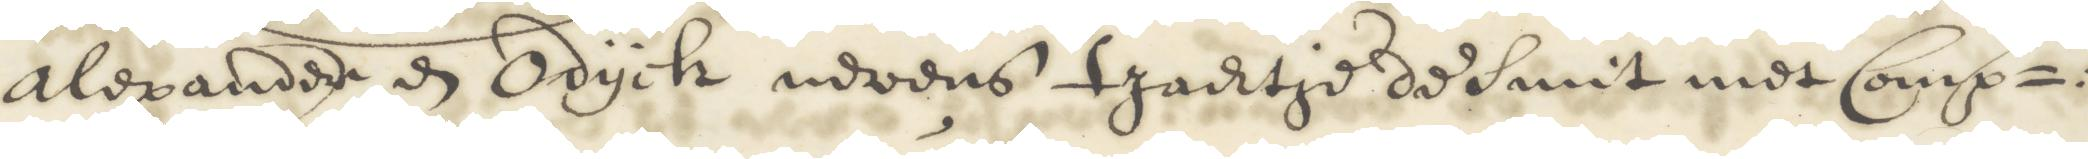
Alexander en Odijck nevens 't Jachtje de smit met Comp=:
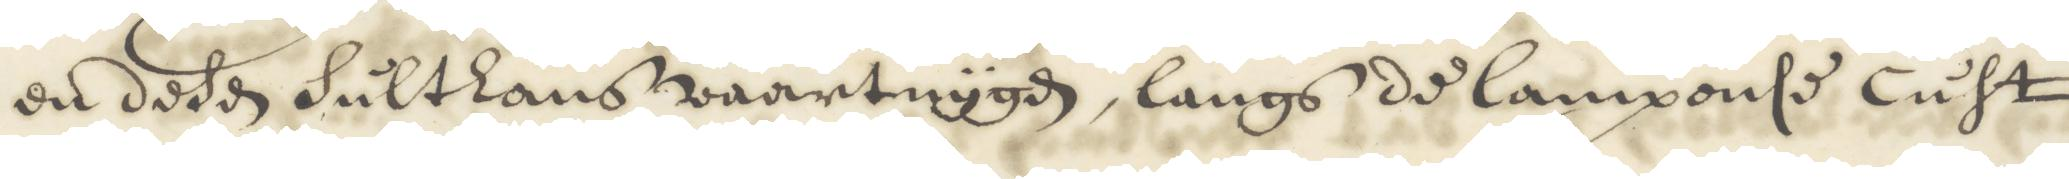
en desen sulthans vaartuijgen, langs de lamponse cust
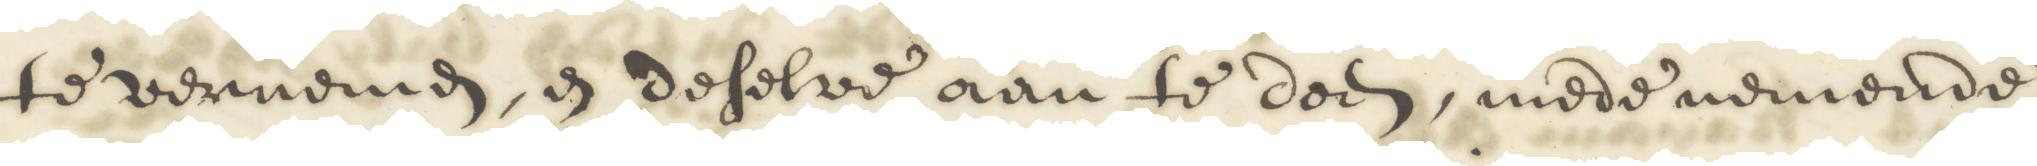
te vernemen, en deselve aan te doen, mede nemende
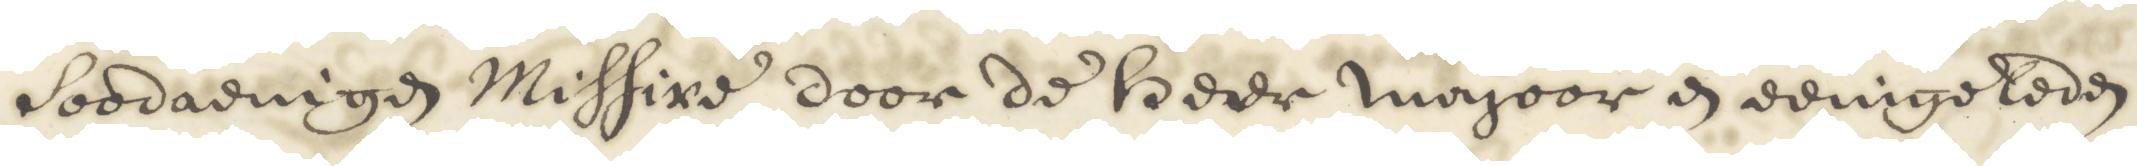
soodaenigen Missive door de Heer majoor en eenige leden
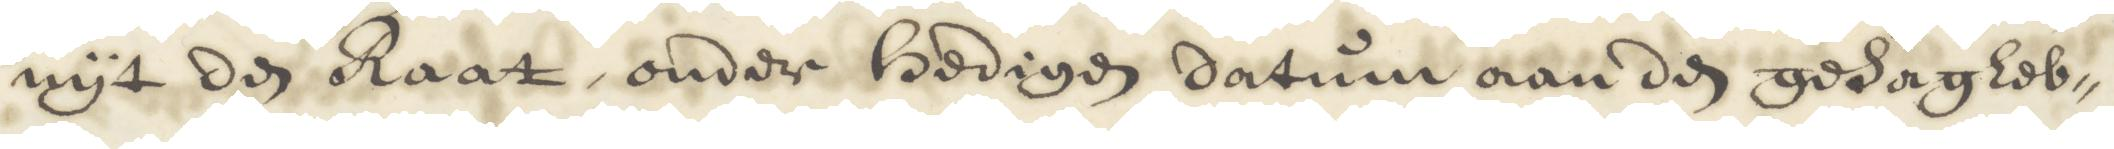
uijt den Raat, onder hedigen datum aan den gesagheb„
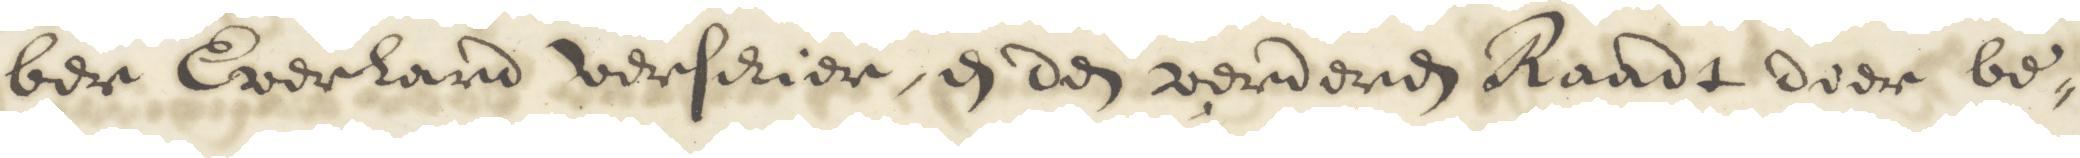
ber Everhard verschier, en den verderen Raadt dier be„
